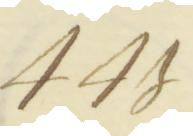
441
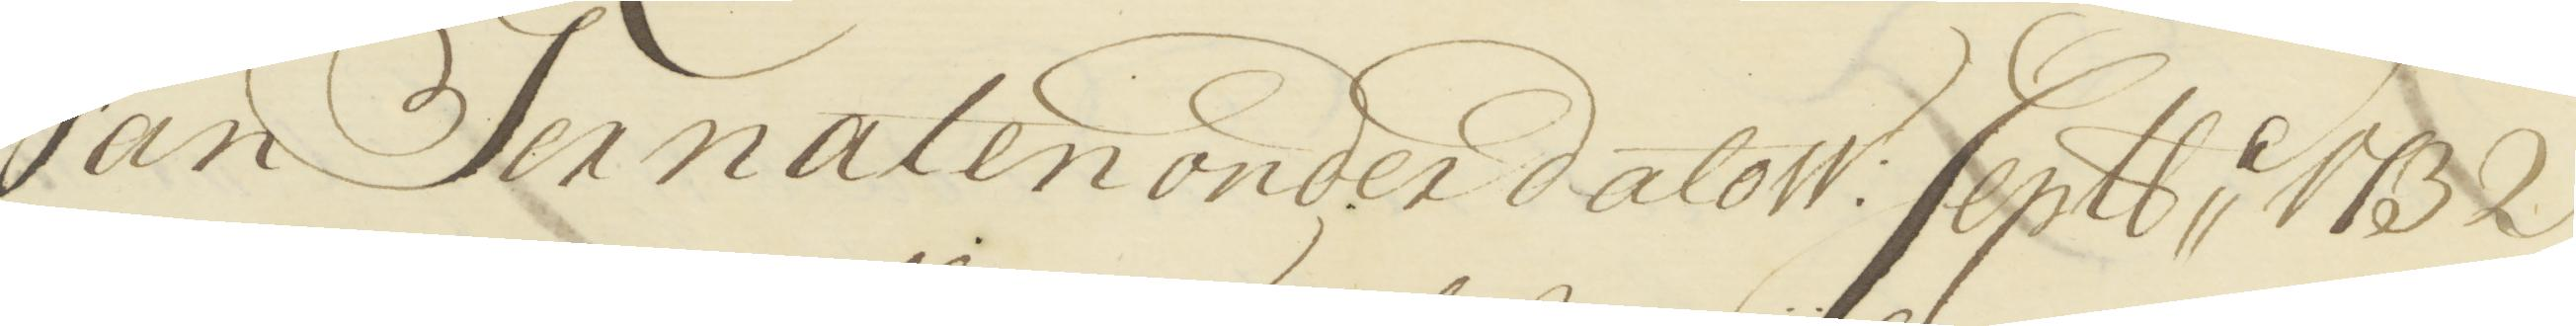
Van Ternaten onder dato 11:' septb„r 1732
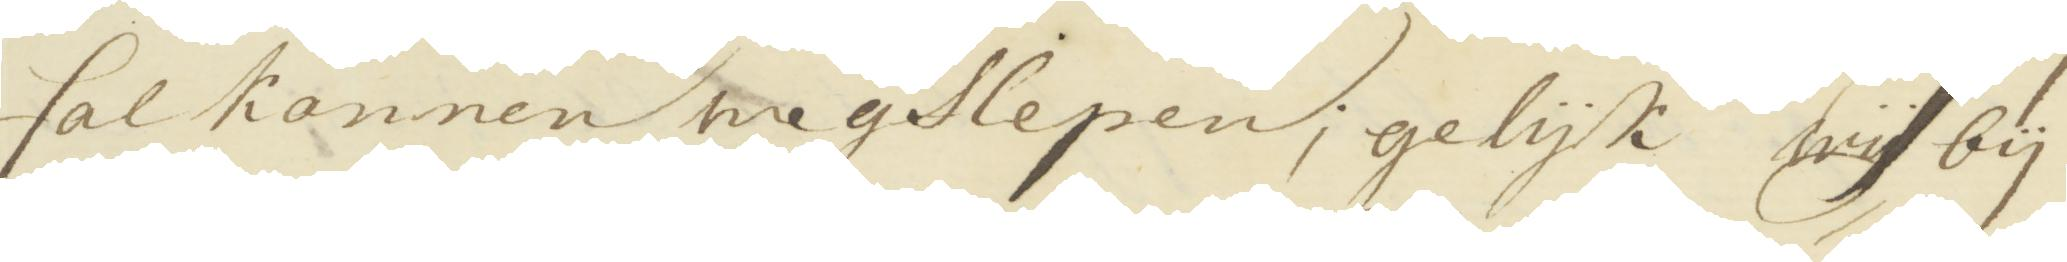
sal konnen weg slepen; gelijk wij bij
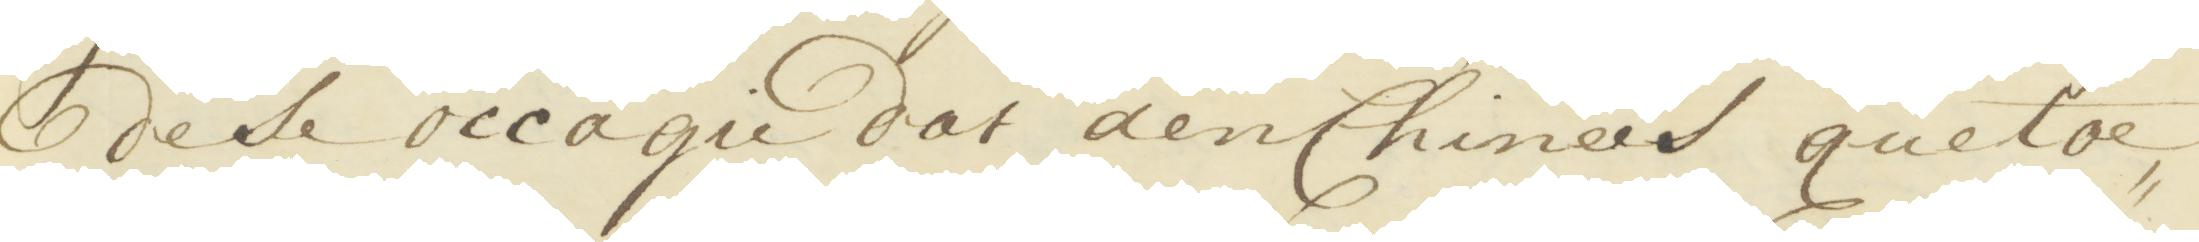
dese occagie dat den Chinees que toe„
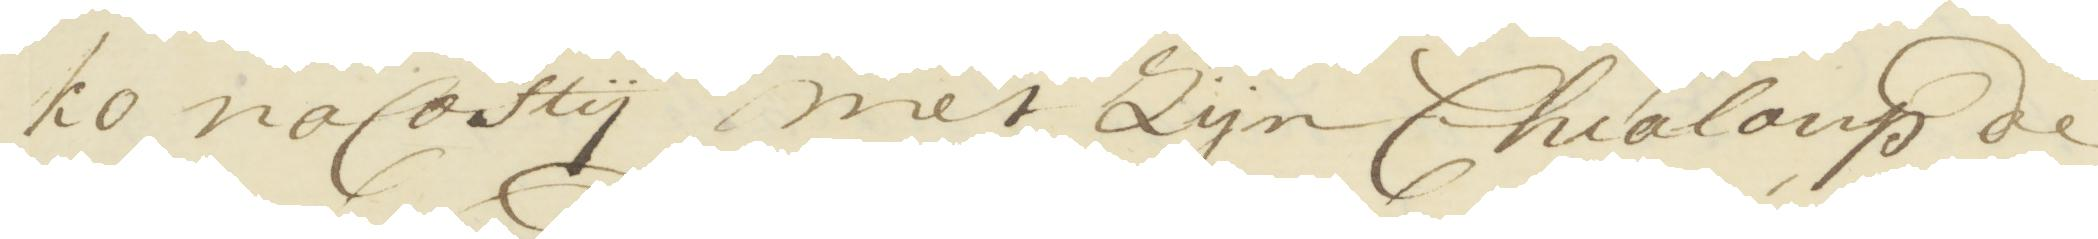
ko na Costij met Zijn Chialoup de
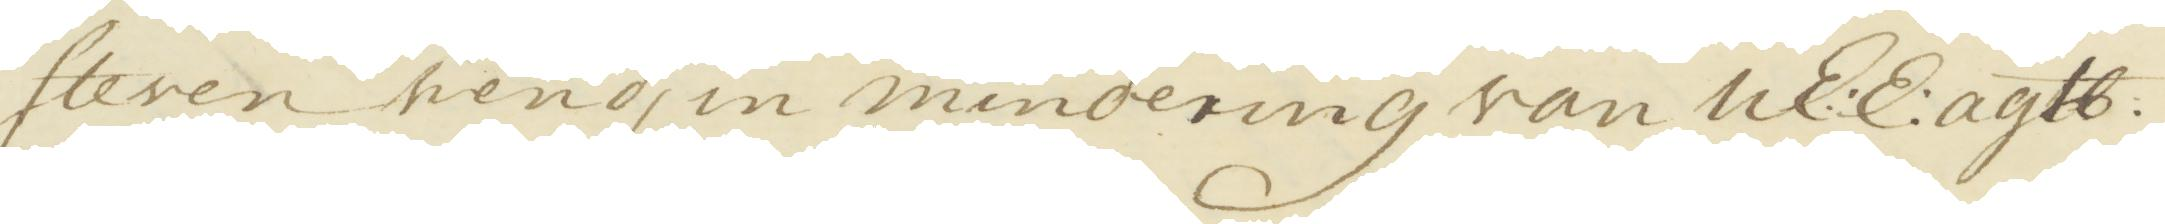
steven wend, in mindering van uE:E: agtb:
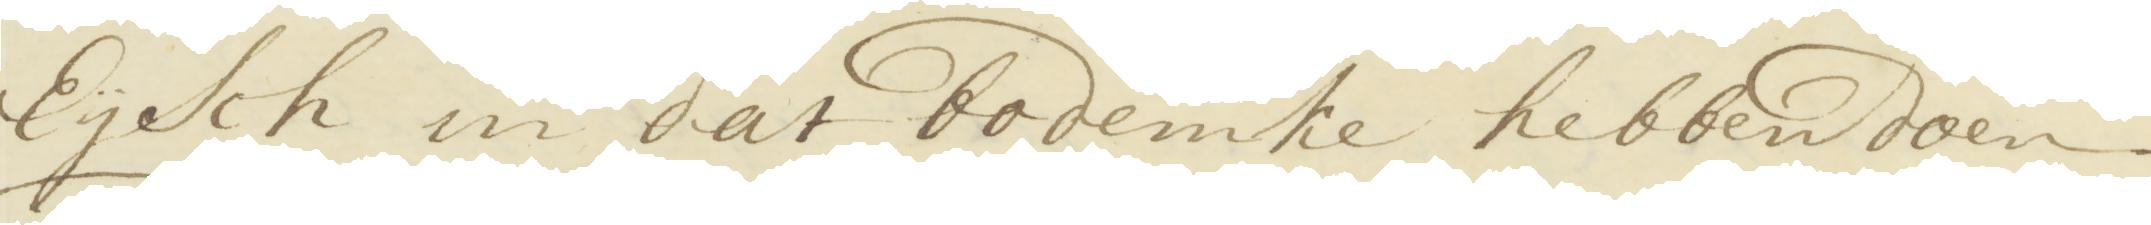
Eijsch in dat bodemke hebben doen
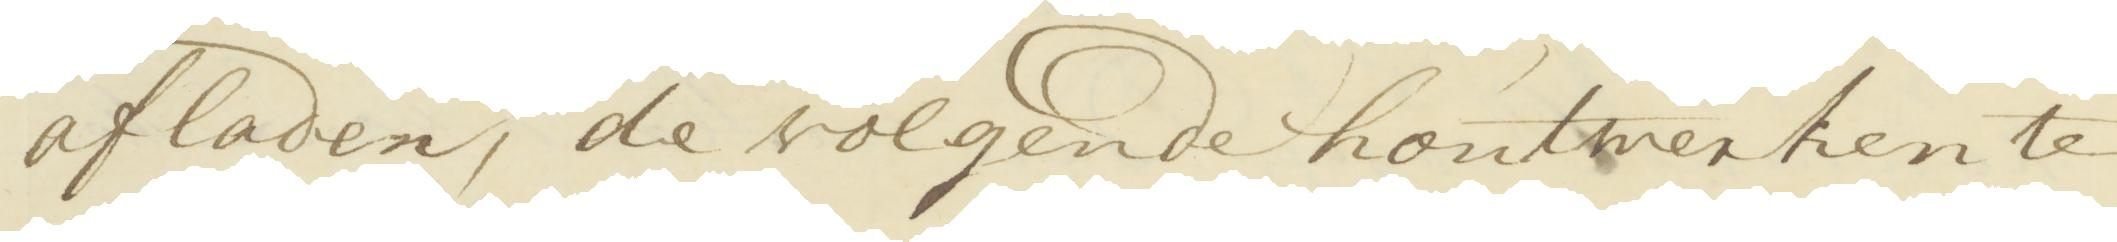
afladen, de volgende houtwerken te
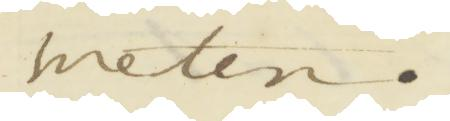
weten.
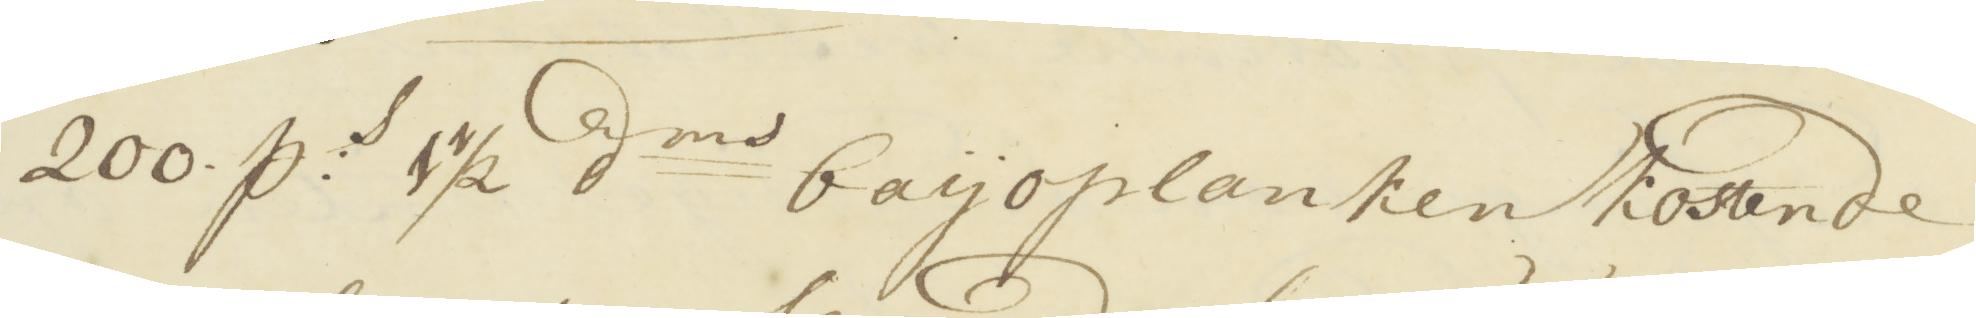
200. p:s 1½ d=ms baijoplanken kostende
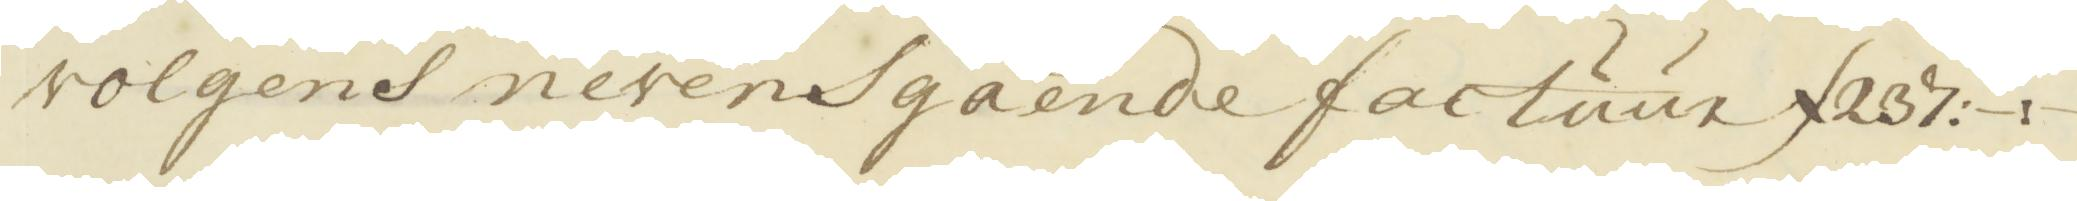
volgens nevens gaende factuur ƒ237:—:—
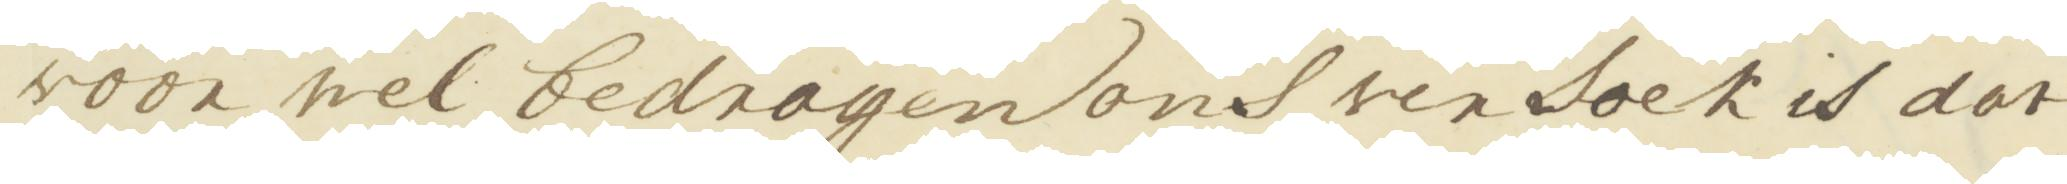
voor wel bedragen ons versoek is dat
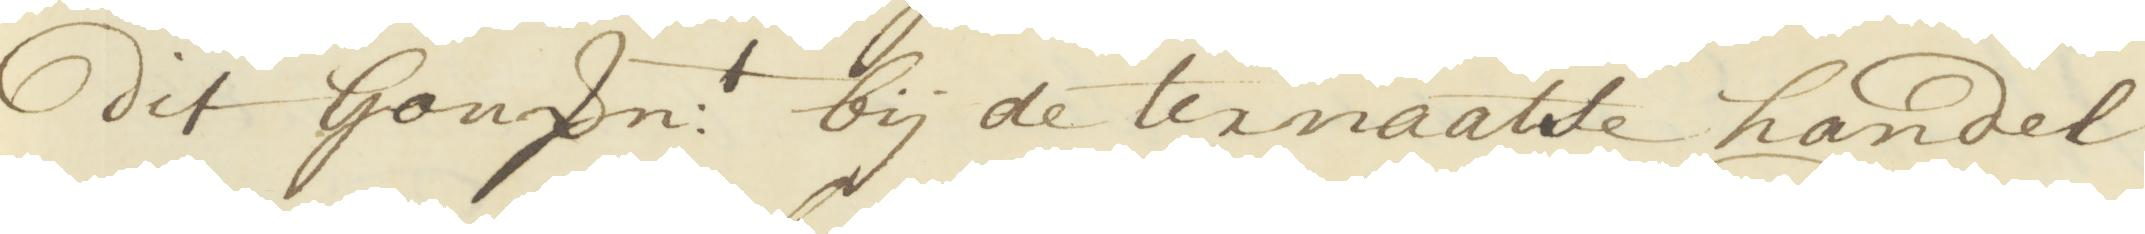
dit Gouvern:t bij de ternaatse handel
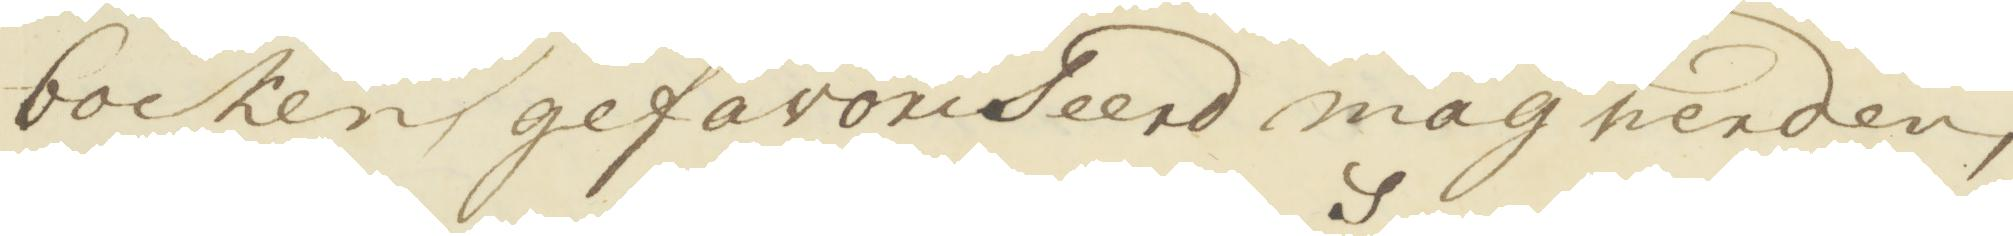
boeken gefavoriseerd mag werden;
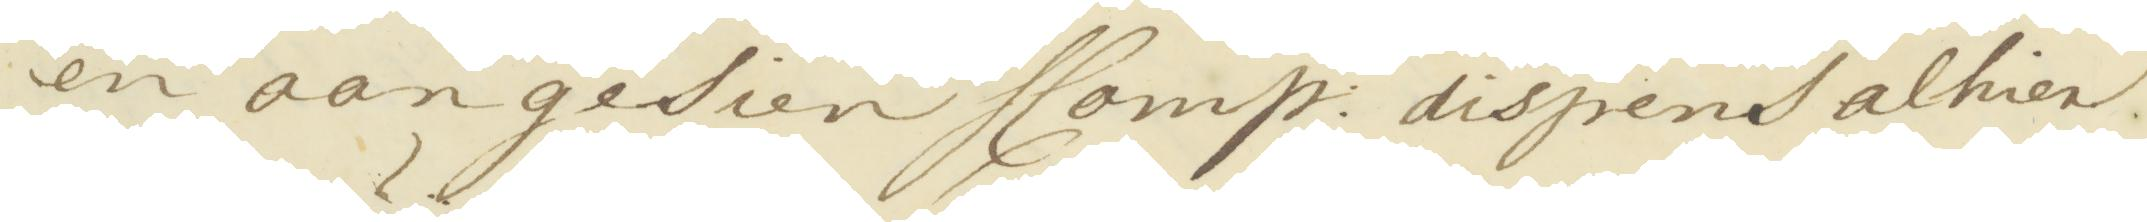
en aangesien 'sComp:s dispens alhier
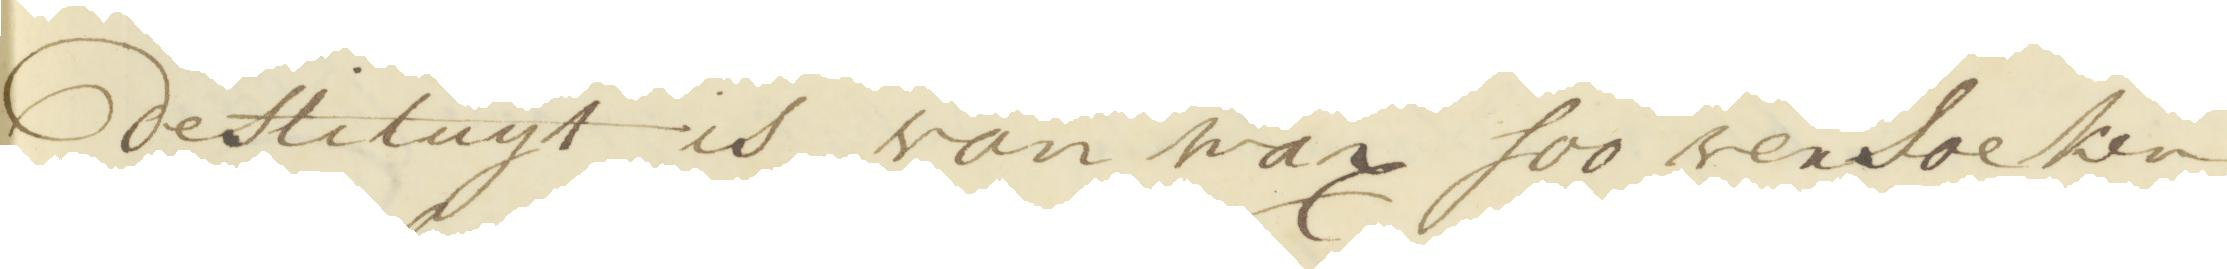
destituijt is van wax soo versoeken
